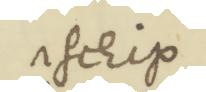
^schip
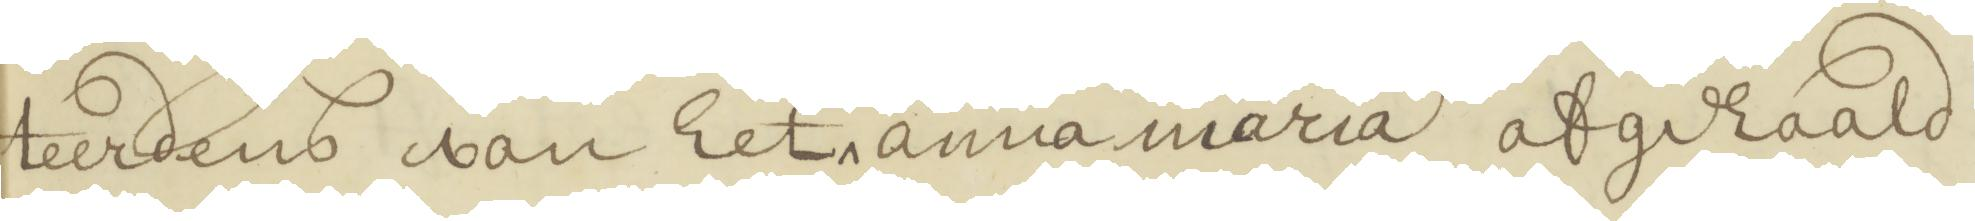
teerdens van het ^ anna maria afgehaald
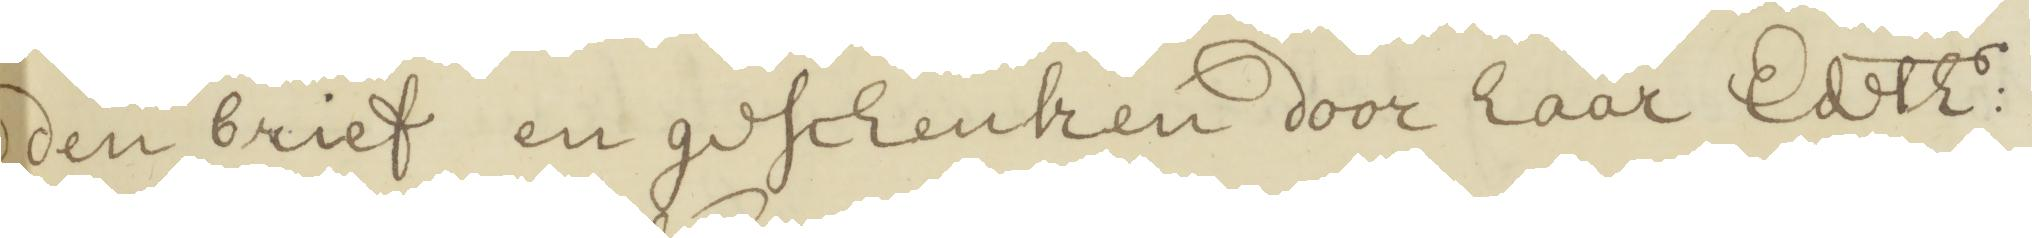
den brief en geschenken door haar Edelh:s
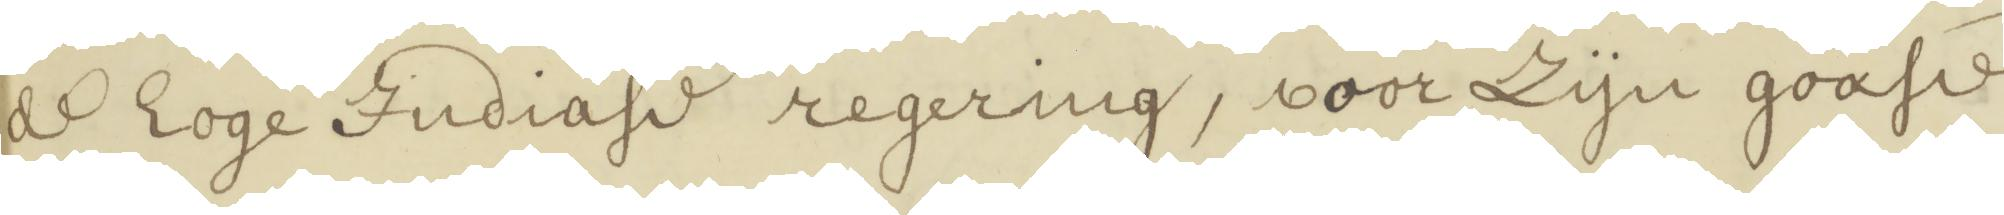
de hoge Indiase regering, voor zijn goase
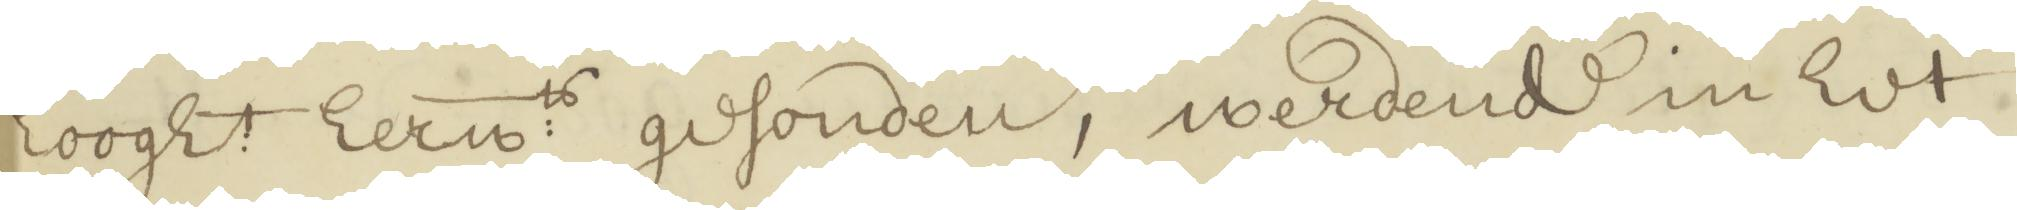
hoogh:t herw:ts gesonden, werdende in het
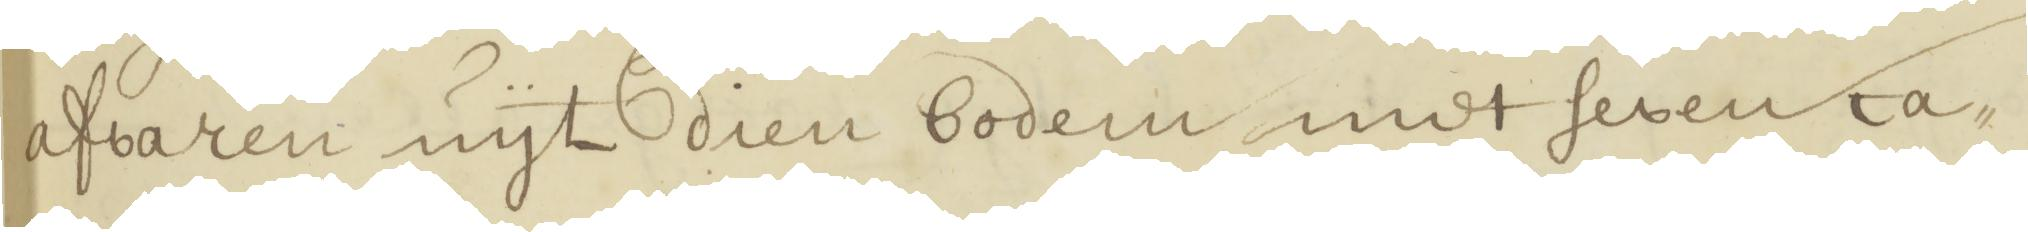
afvaren uijt dien bodem met seven ca„
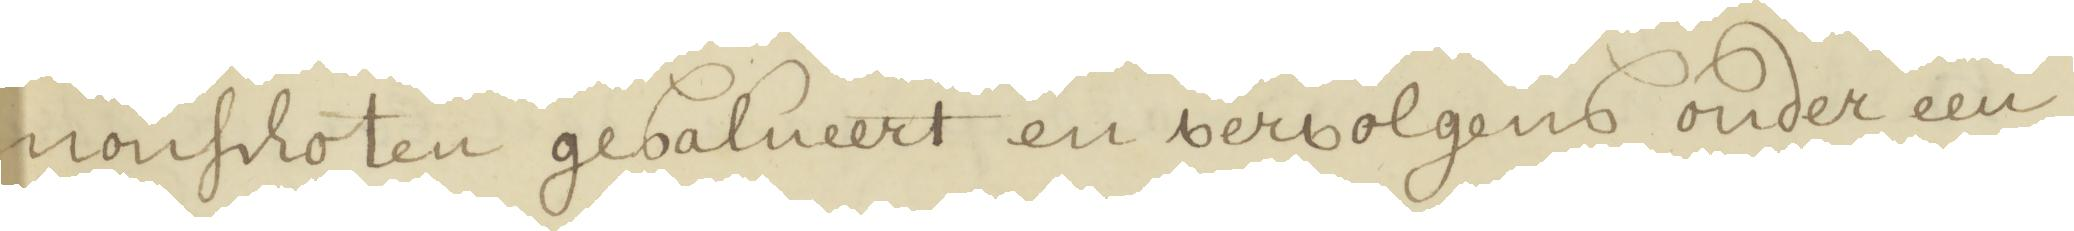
nonschoten gesalueert en vervolgens onder een
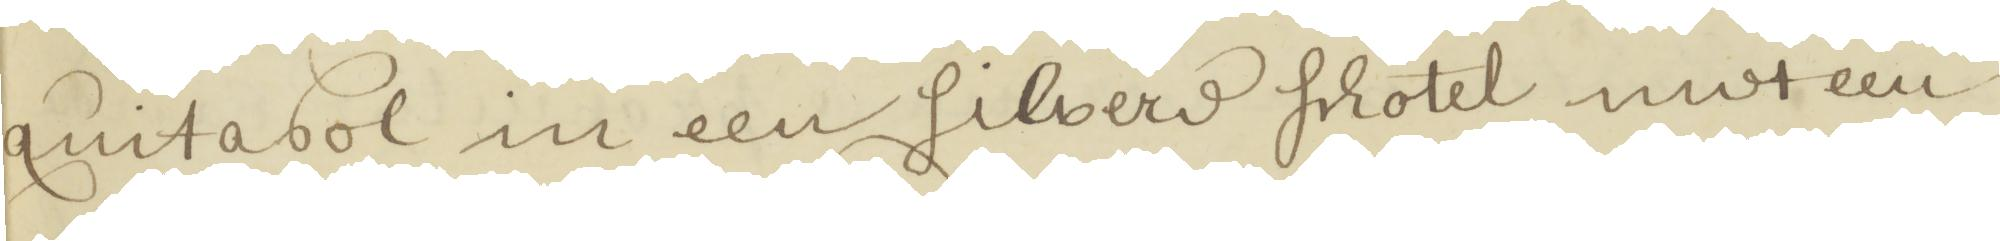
quitasol in een silvere schotel met een
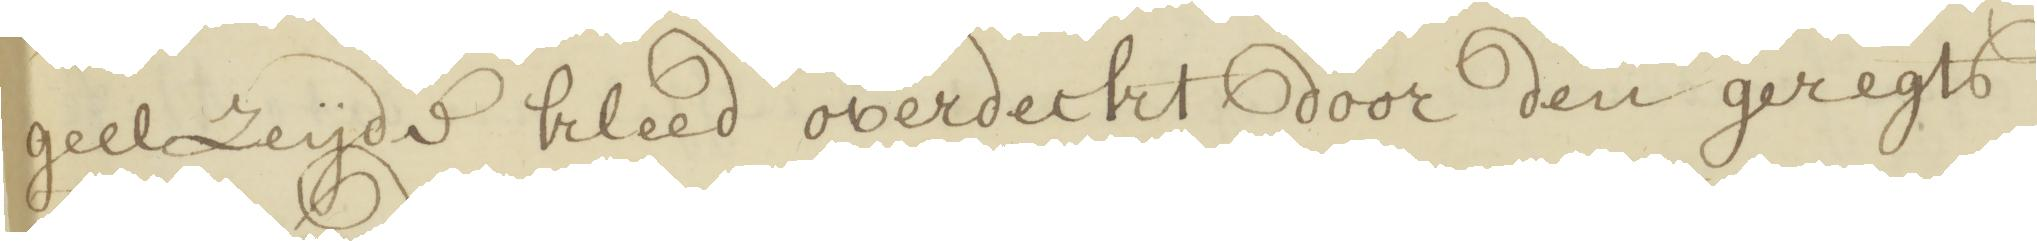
geel zeijde kleed overdeckt door den geregts
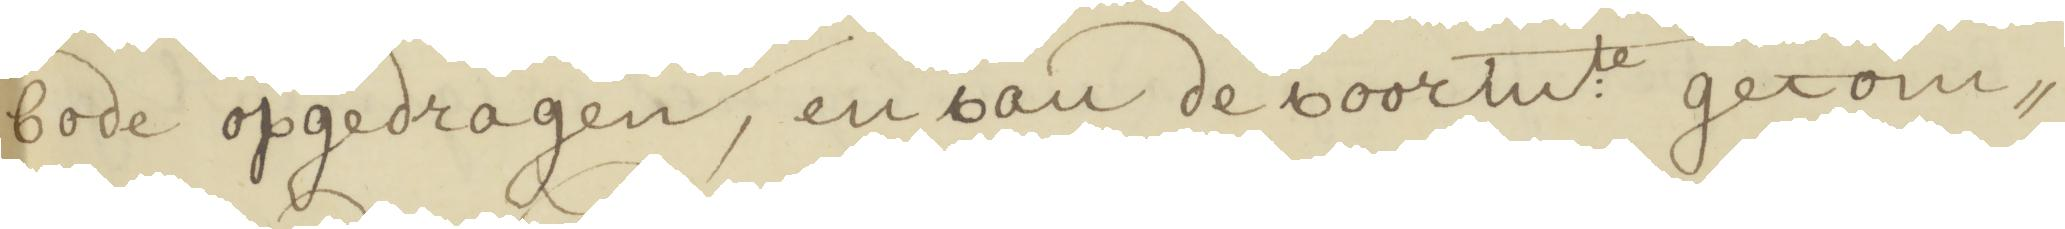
bode opgedragen, en van de voorm:te gecom„
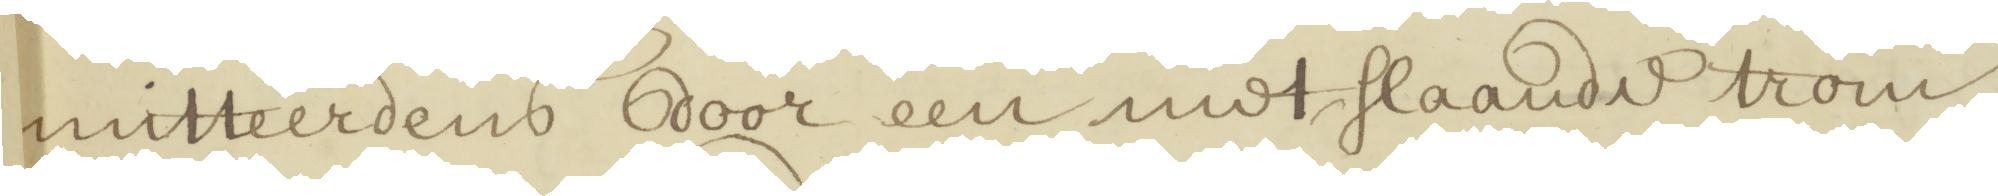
mitteerdens door een met slaande trom
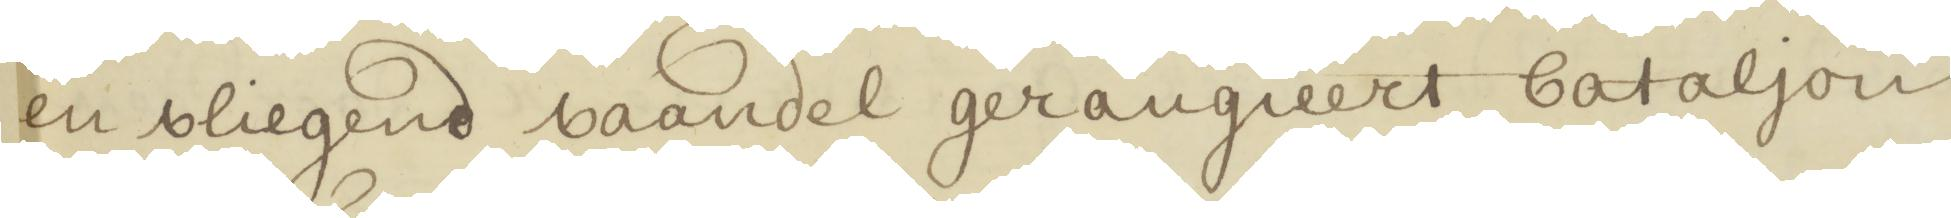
en vliegend vaandel gerangieert bataljon
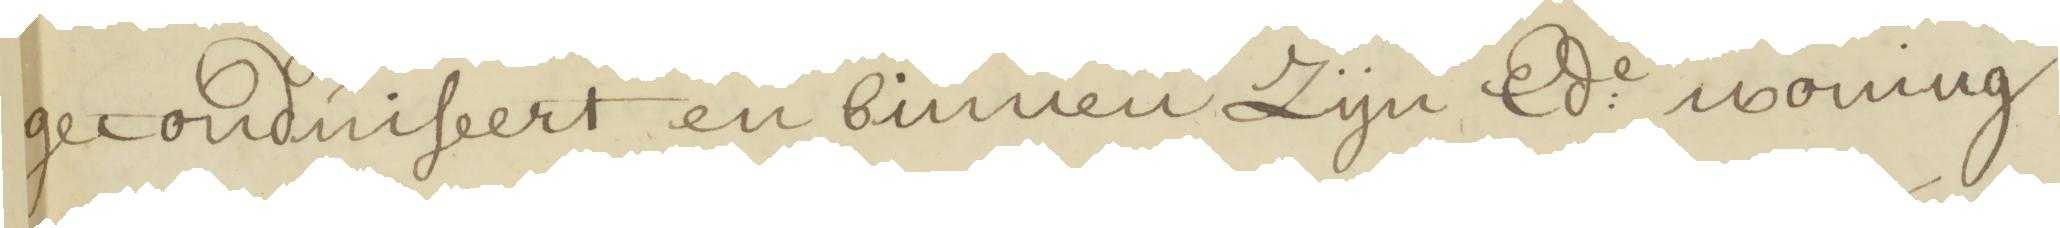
geconduiseert en binnen zijn Ed:e woning
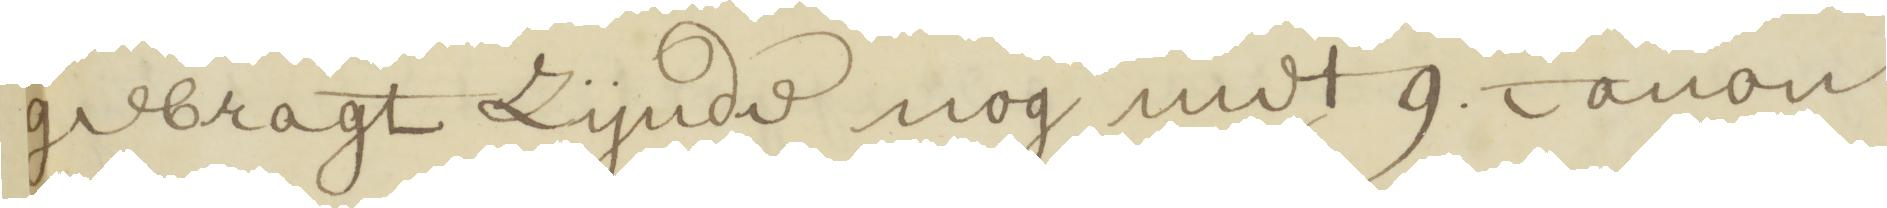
gebragt zijnde nog met 9. canon
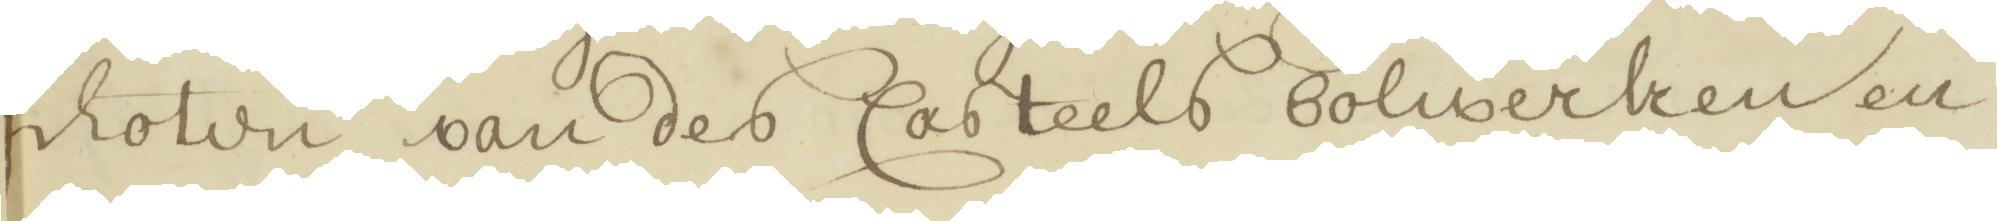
choten van des Casteels bolwerken en
